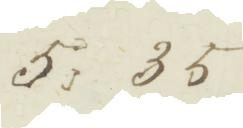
5, 35
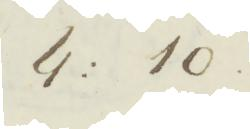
4: 10 .
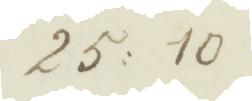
25: 10
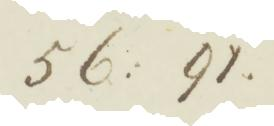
56: 91.
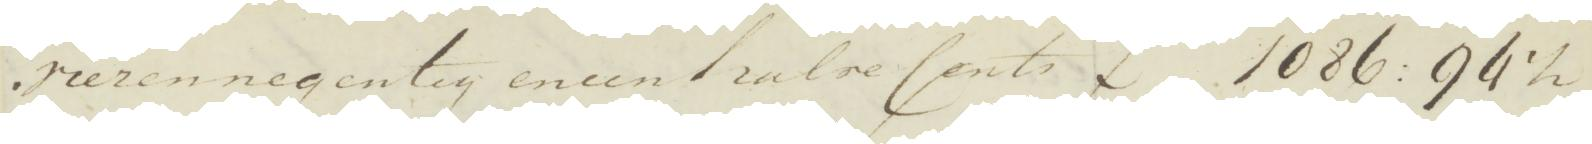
.vierennegentig en een halve Cents ƒ 1086: 94½
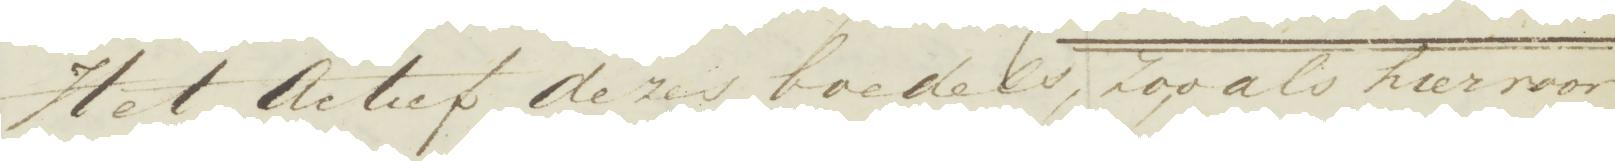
Het Actief dezes boedels, zoo als hier voor
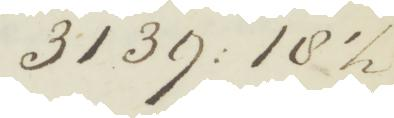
3139: 18½
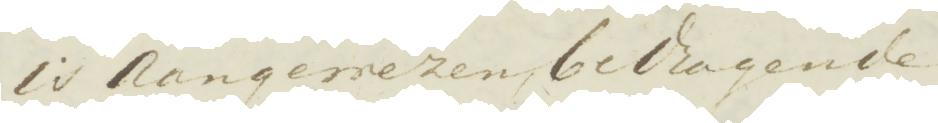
is Aangewezen, bedragende
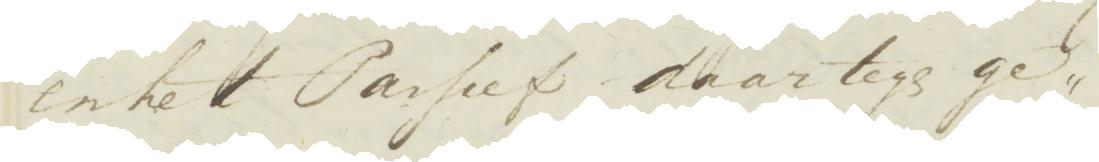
en het Passief daar tege ge„
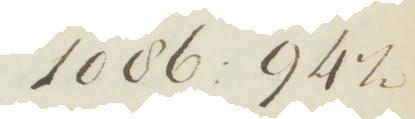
1086: 94½
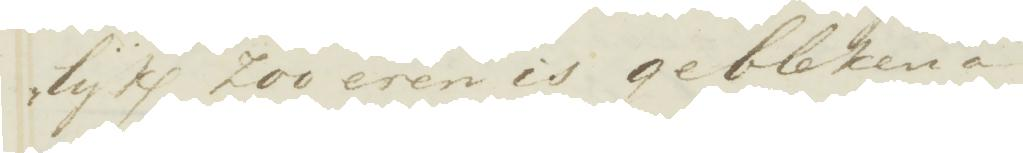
„lijk zoo even is gebleken
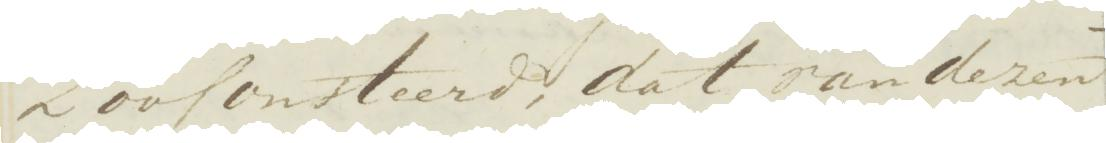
Zoo Consteerd, dat van dezen
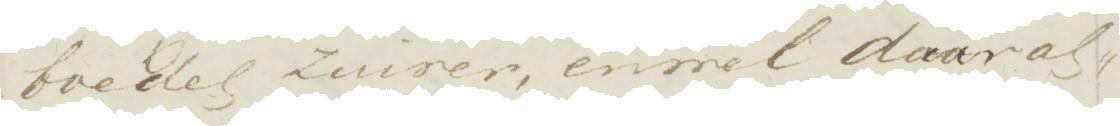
boedel zuiver, en wel daar al„
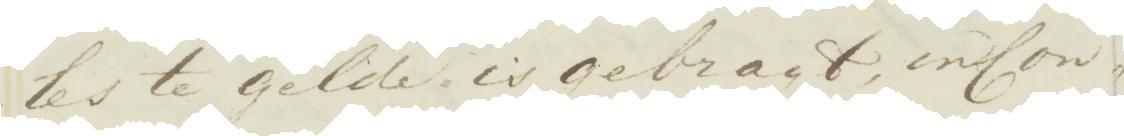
les te gelde is gebragt, in Con„
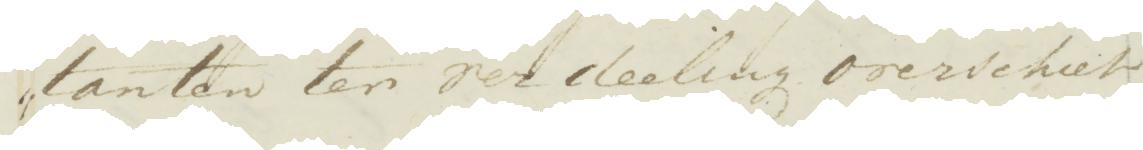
„tanten ter verdeeling overschiet
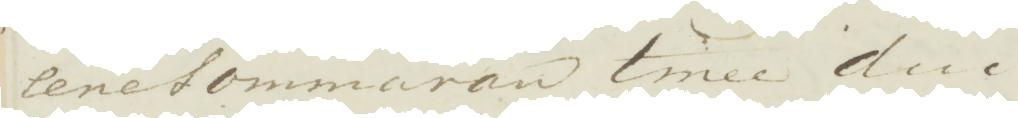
eene somma van twee dui
